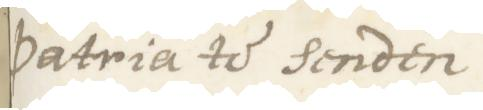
patria te senden
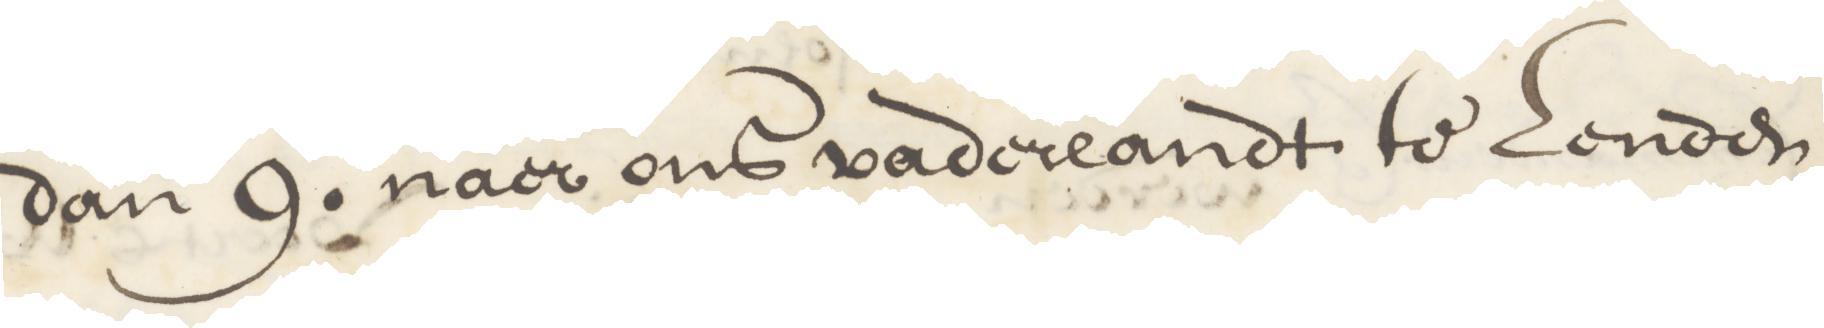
dan 9. naer ons vaderlandt te zenden,
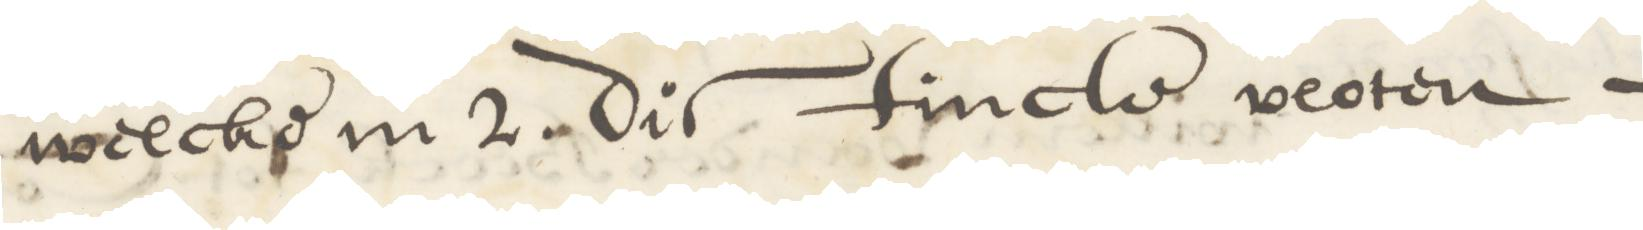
welcke in 2 distincte vloten
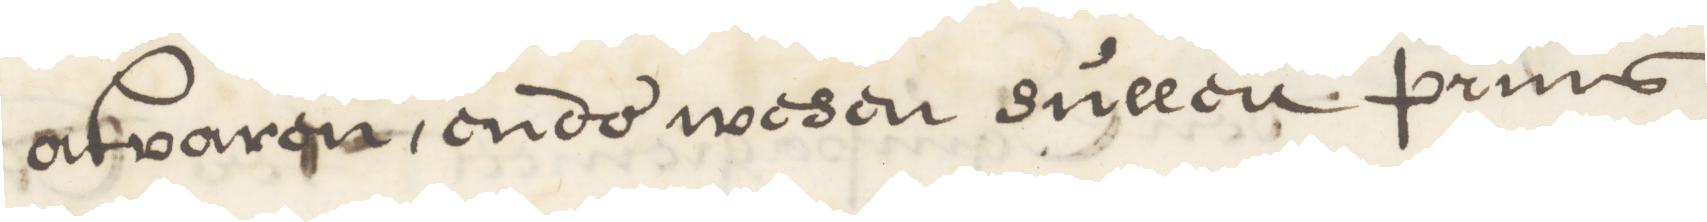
afvaren, ende wesen sullen prins
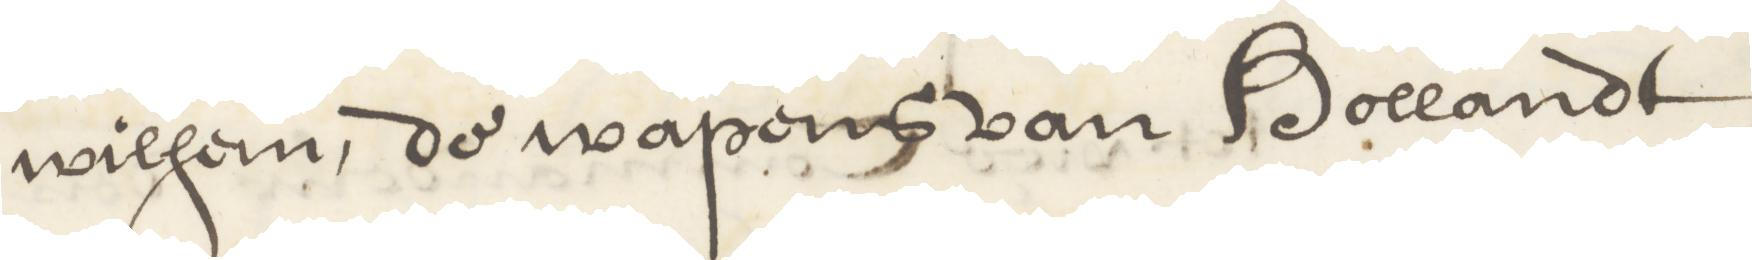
wilhem, de wapens van Hollandt
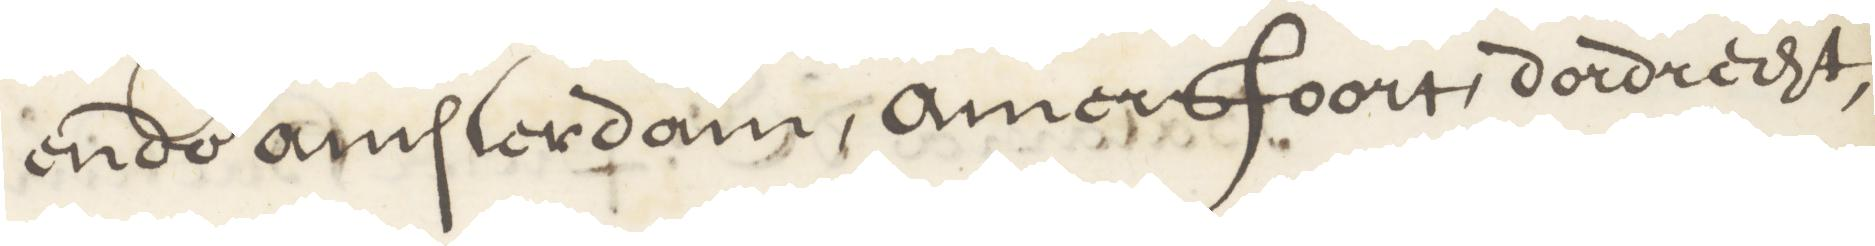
ende amsterdam, amersfoort, dordrecht,
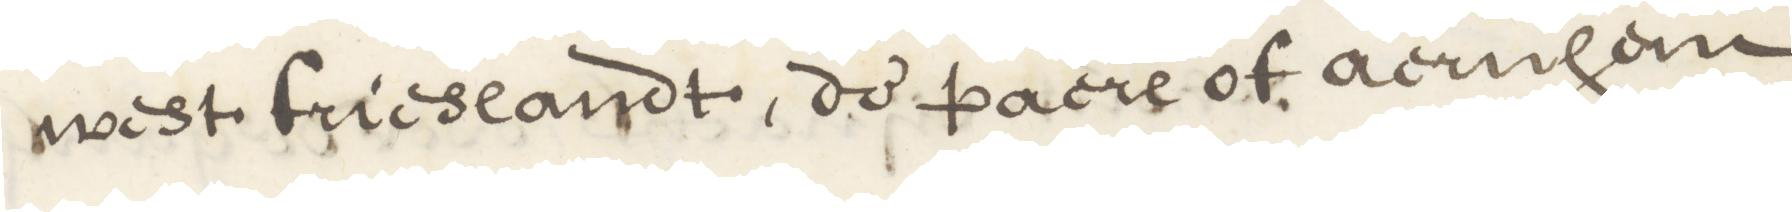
west frieslandt, de paerl of aernhem,
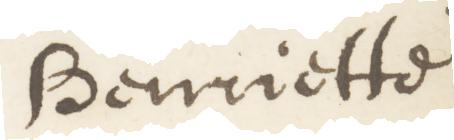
Henriette
